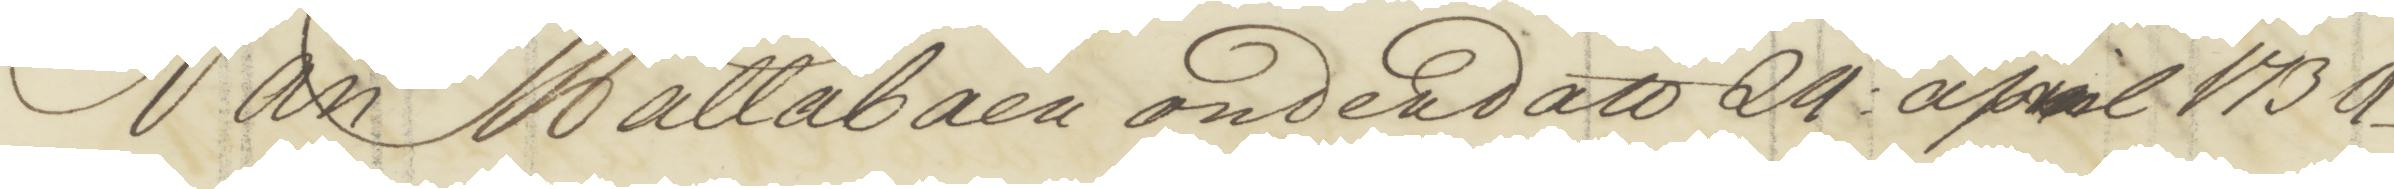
Van Mallabaer onder dato 24:' april 1734
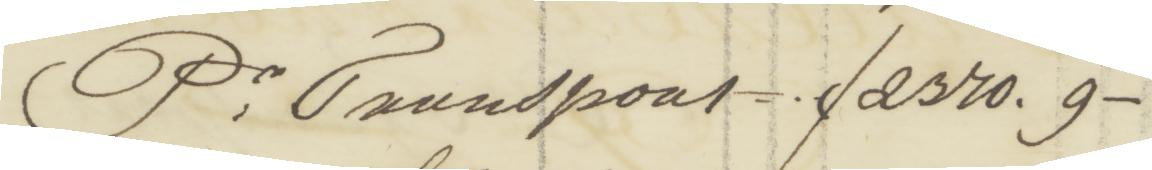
P„r Transport = . ƒ 2370. 9—
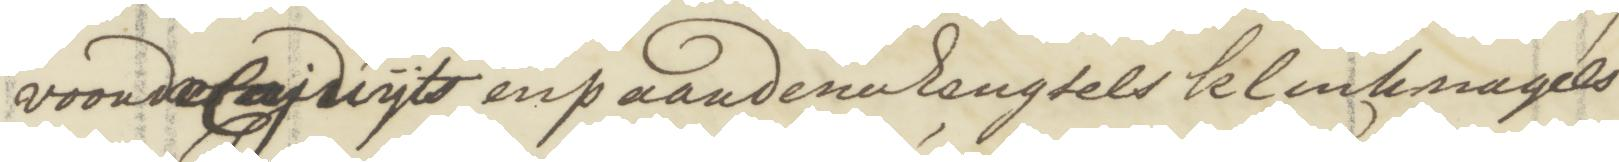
voor de Cajuijts en paardenahengsels klink nagels
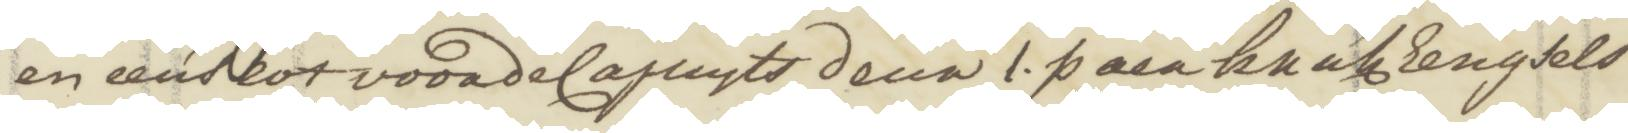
en een slot voor de Cajuyts deur 1. paer kruk hengsels
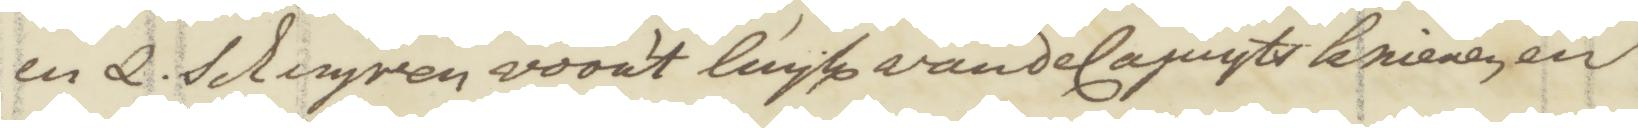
en 2. schryven voor't luijk van de Cajuyts knieren en
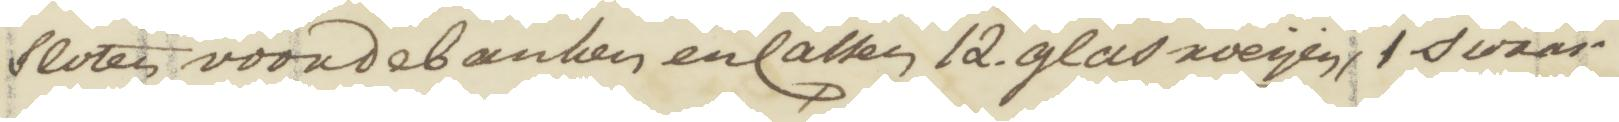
sloten voor de banken en Cassen 12. glas roeijen, 1 swaar
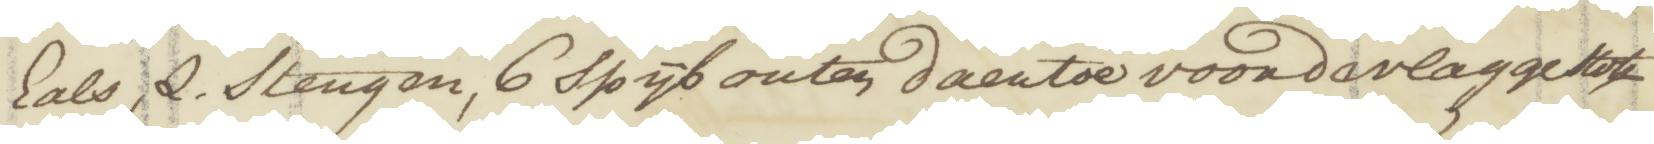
hals, 2. stengen, 6 spijbouten daertoe voor devlaggestok
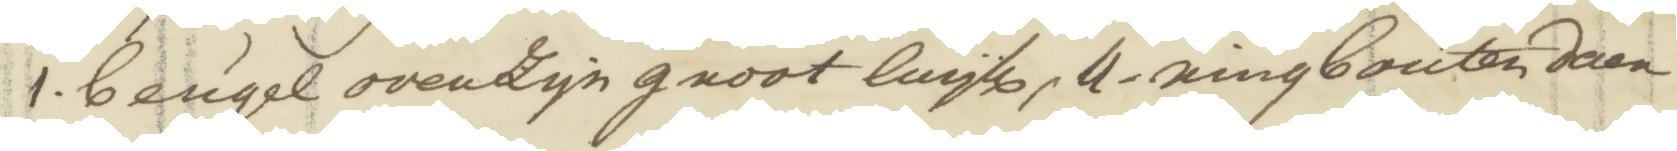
1. beugel over zijn groot luijk, 4- ring bouten daer
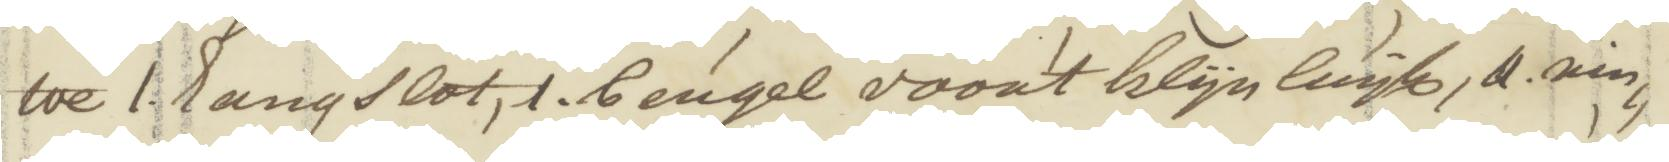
toe 1. hangslot, 1. beugel voor ’t klijn luijk, 4. rin„
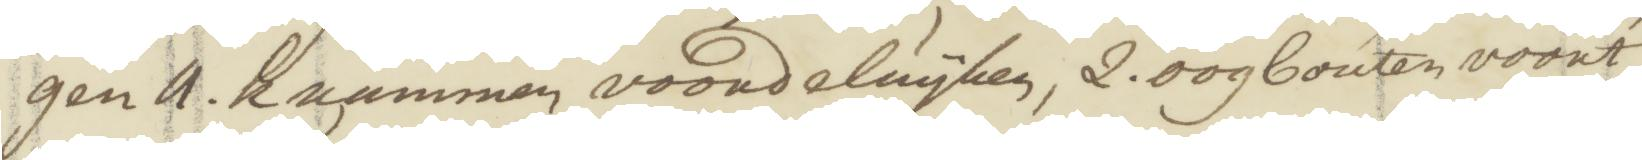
gen 4. krammen voordeluijken, 2. oogbouten voor't
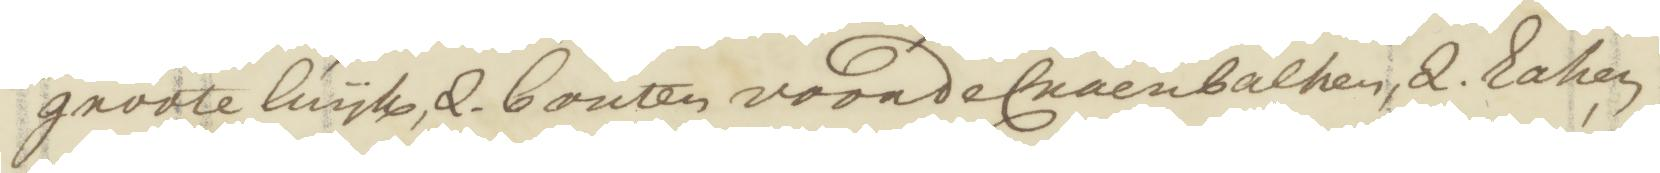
groote luijk, 2. bouten voor de Craenbalken, 2. haken
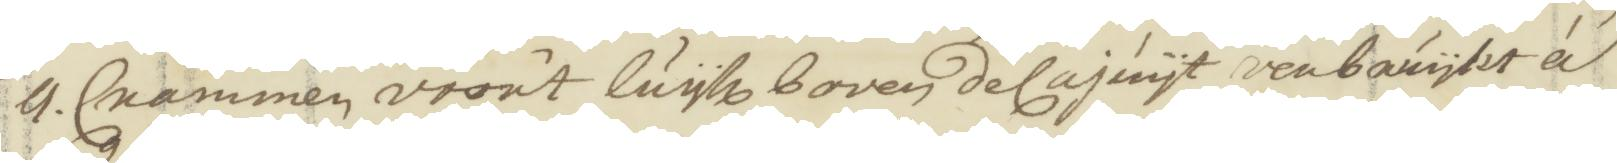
4. Crammen voor’t luijk boven de Cajuijt verbruijkt à
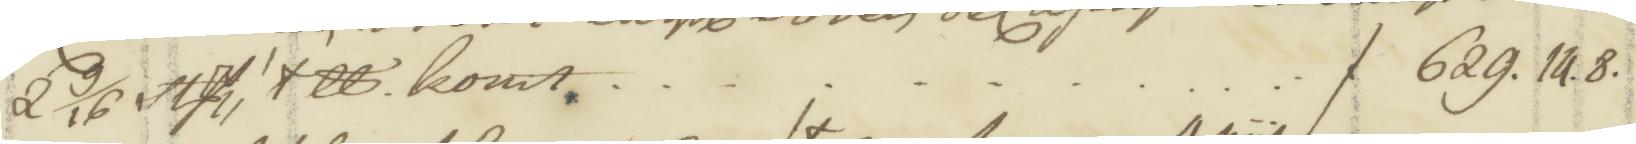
2 9/16 stver„s 't lb. komt . . . . . . . . . . . - ƒ 629. 14. 8.
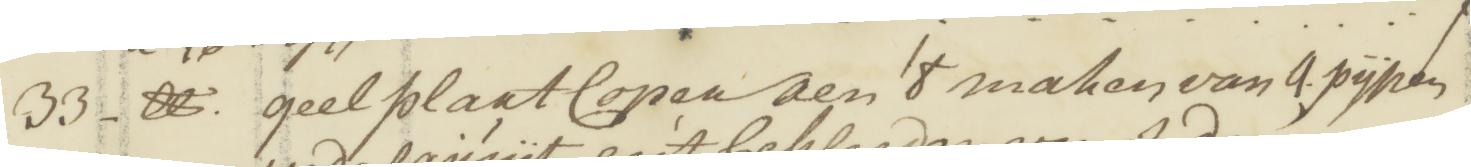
33 – lb. geel plart Coper aen ’t maken van 4. pijpen
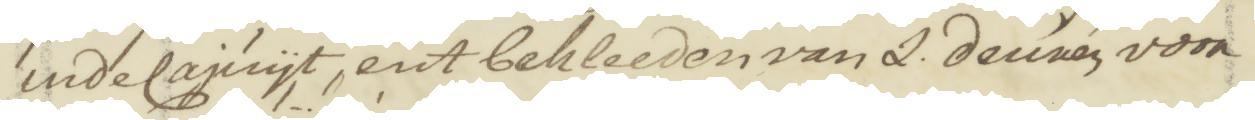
in de Cajuijt, en’t bekleeden van 2. deuren voor
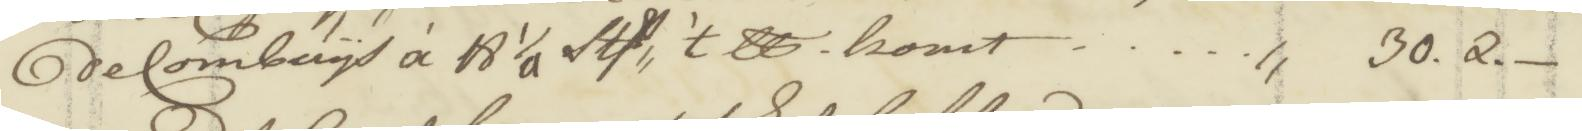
de Combuijs á 18¼ stver„s ’t lb. komt - . - - . „ 30. 2.—
